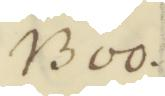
1300.
